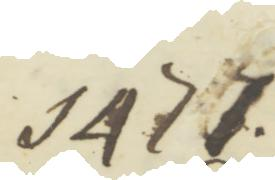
1477.
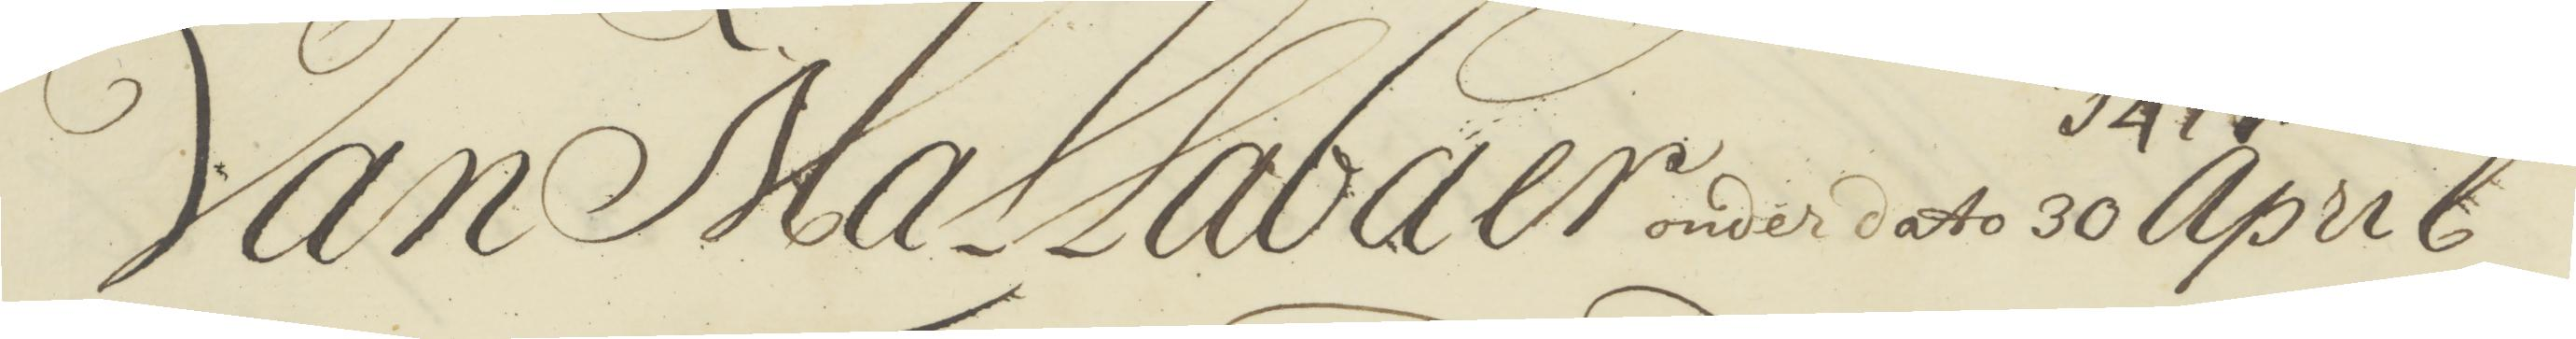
Van Mallabaer onder dato 30 April
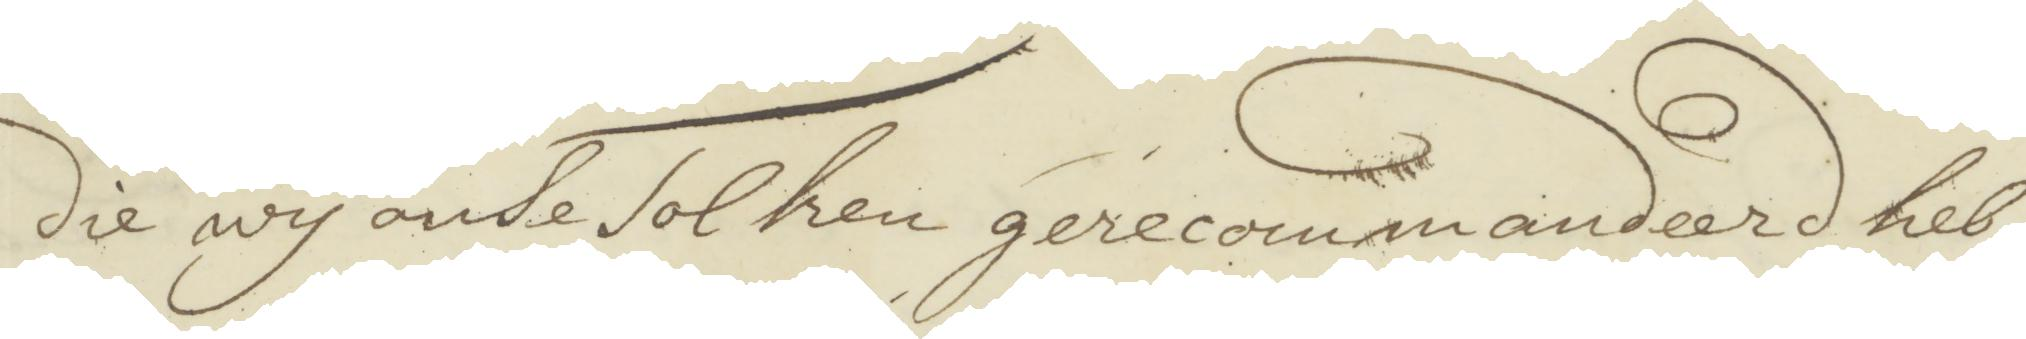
die wij onse Tolken gerecommandeerd heb
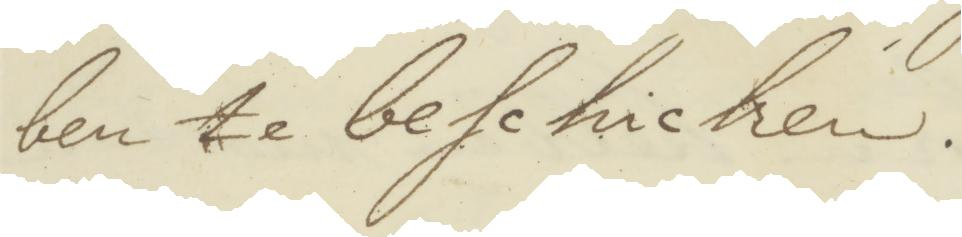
ben te beschicken.
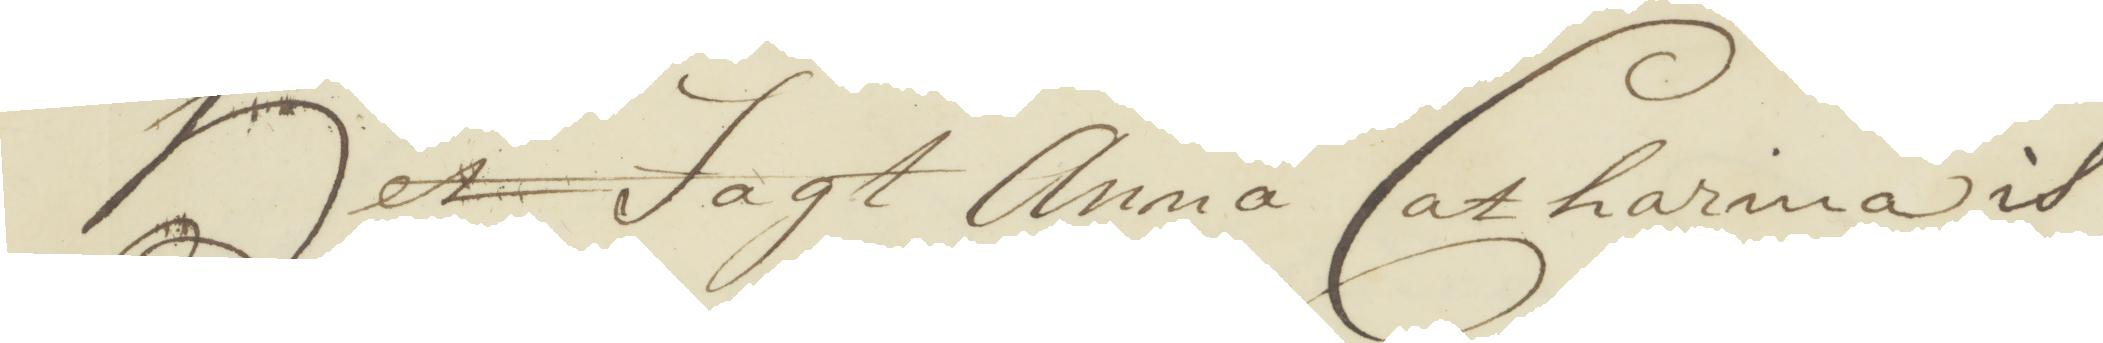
Het Iagt Anna Catharina is
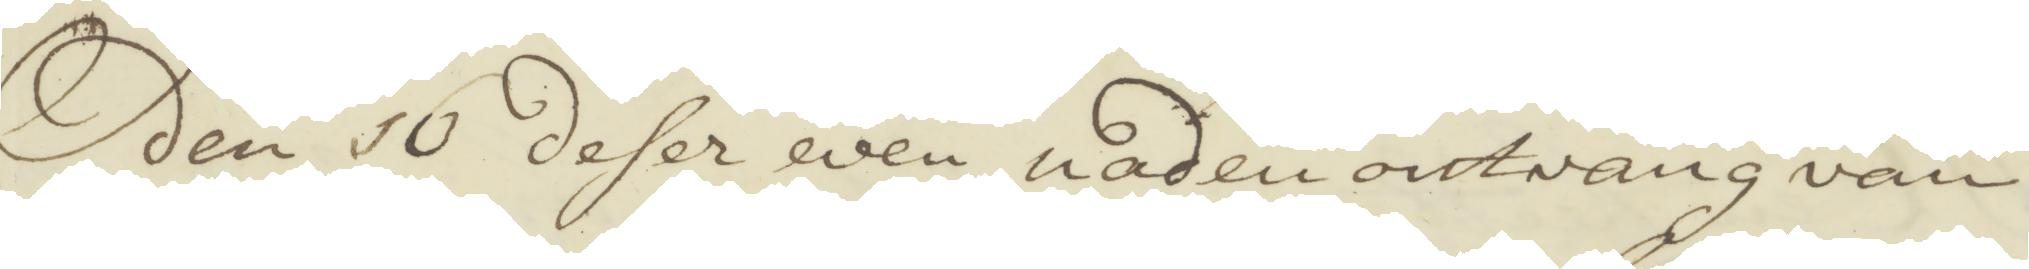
den 16 deser even naden ontvang van
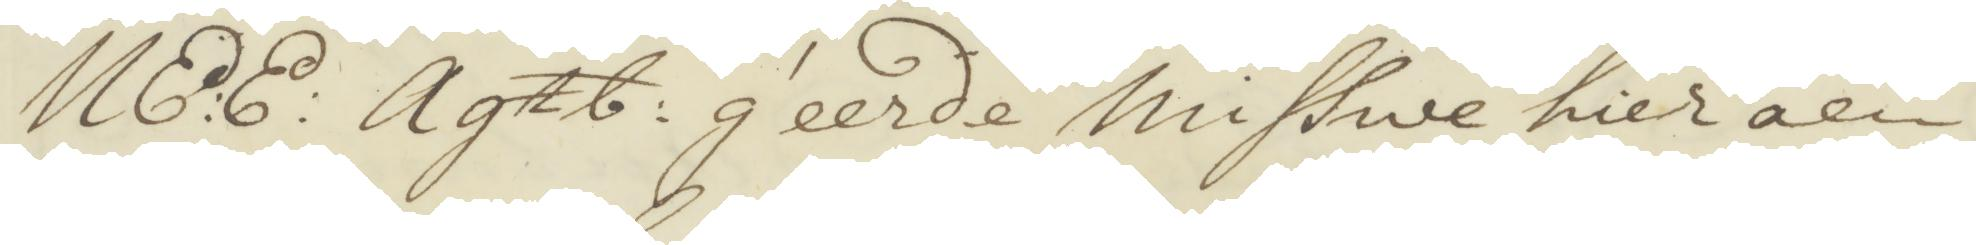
UE: E: Agtb: g’eerde missive hier aen
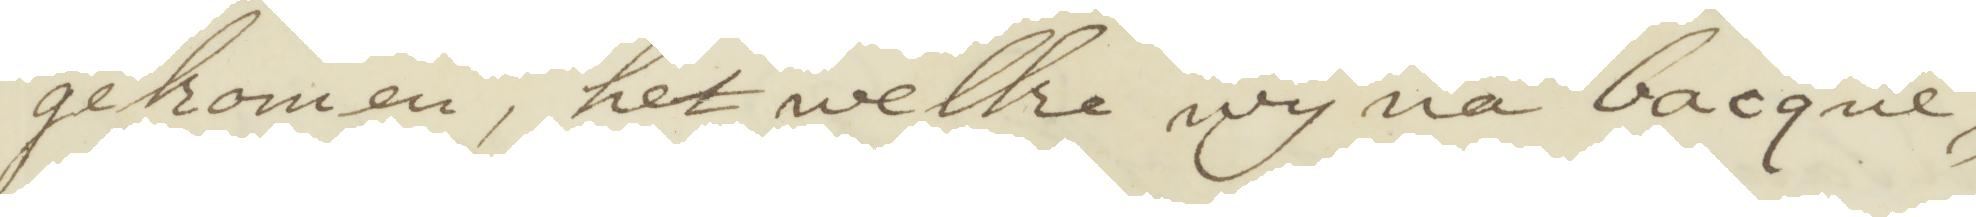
gekomen, het welke wij na bacque„
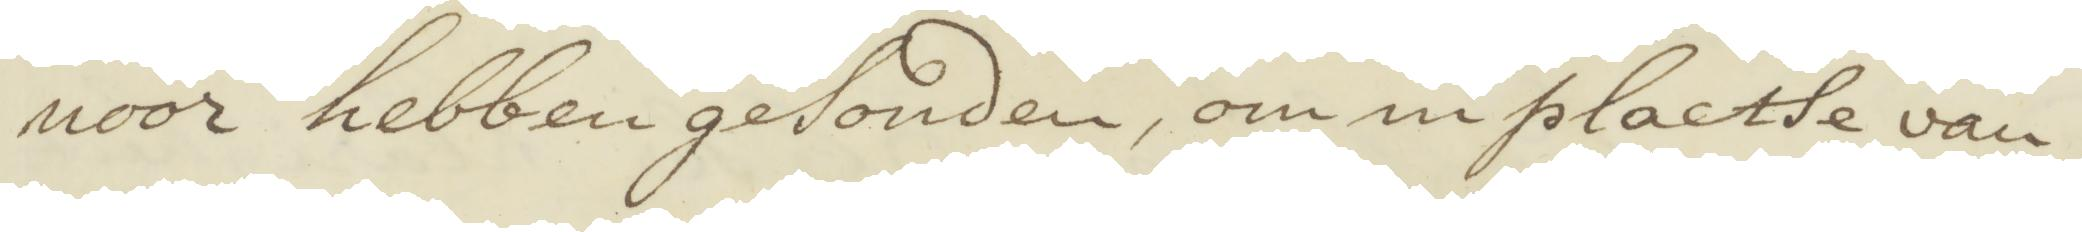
noor hebben gesonden, om in plaetse van
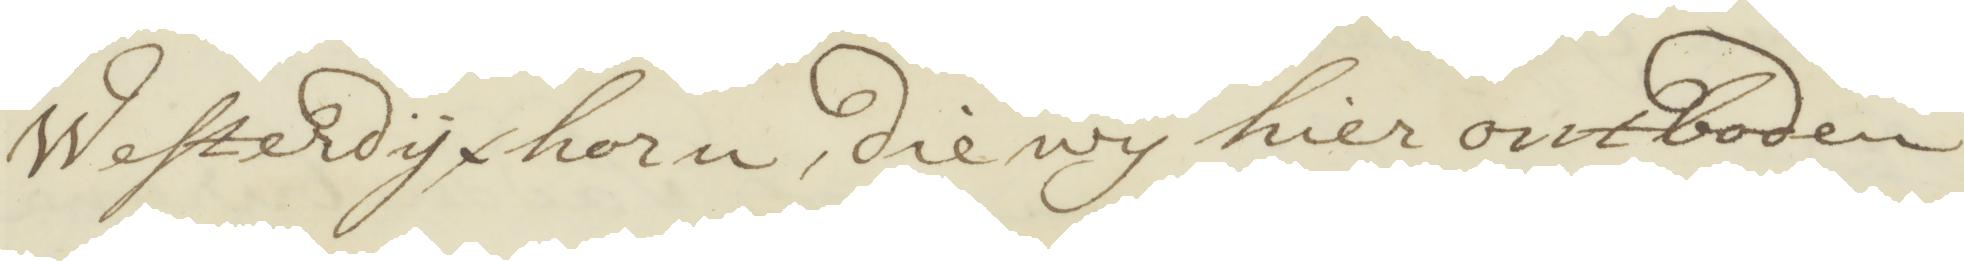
Westerdijxhorn, die wij hier ontboden
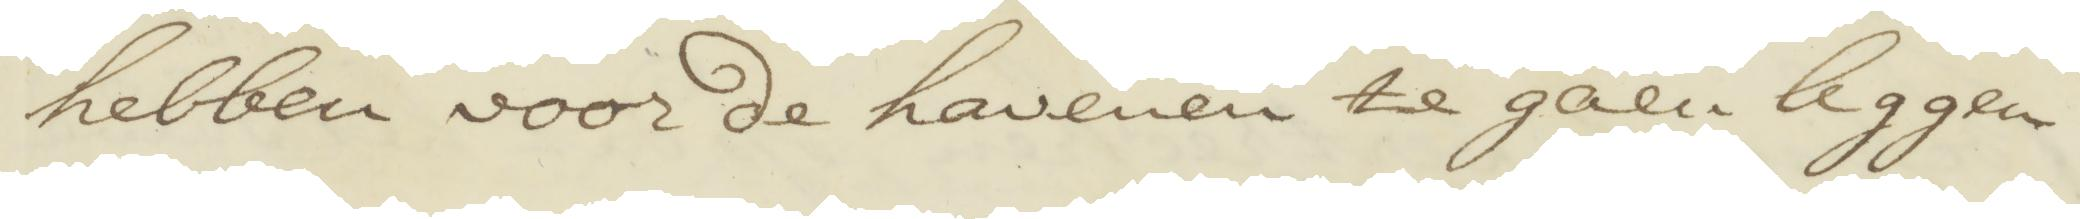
hebben voor de havenen te gaen leggen
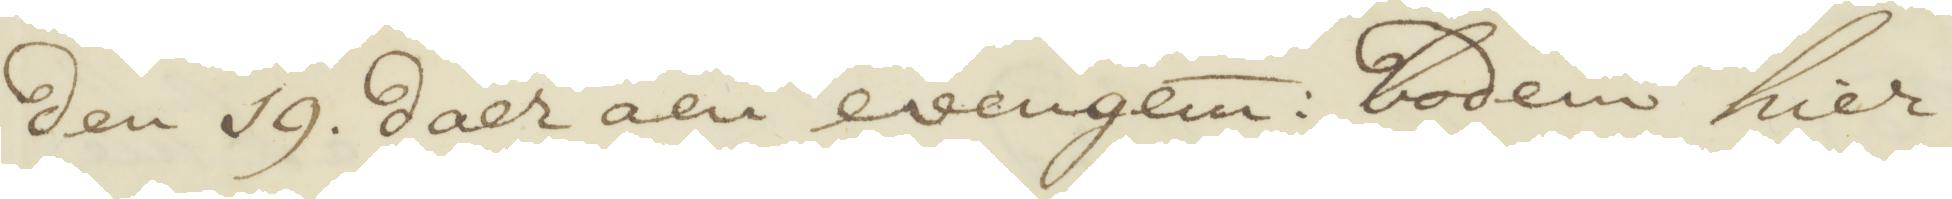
den 19. daer aen evengem: bodem hier
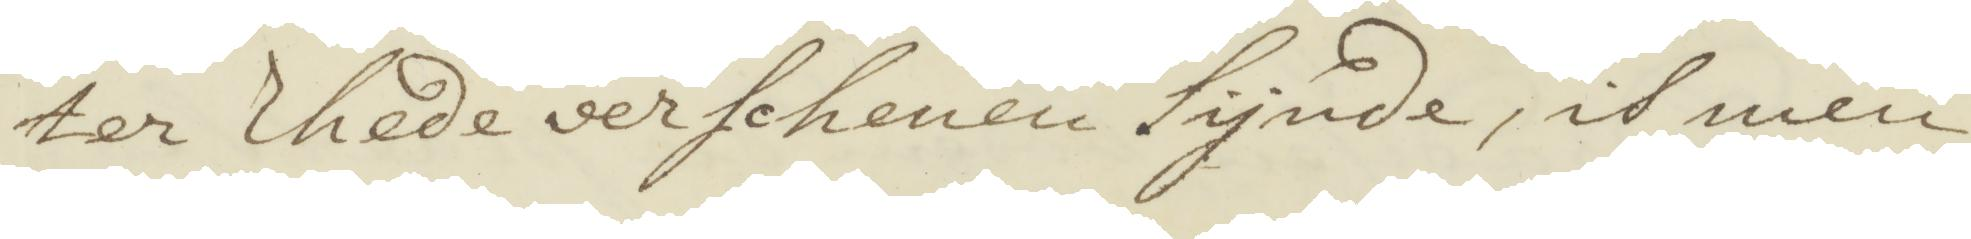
ter rhede verschenen sijnde, is men
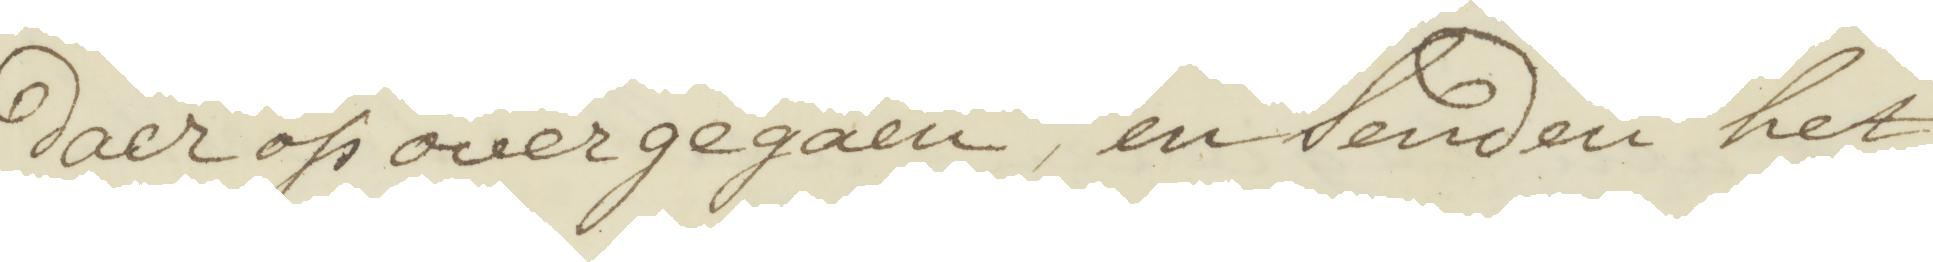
daer op overgegaen, en senden het
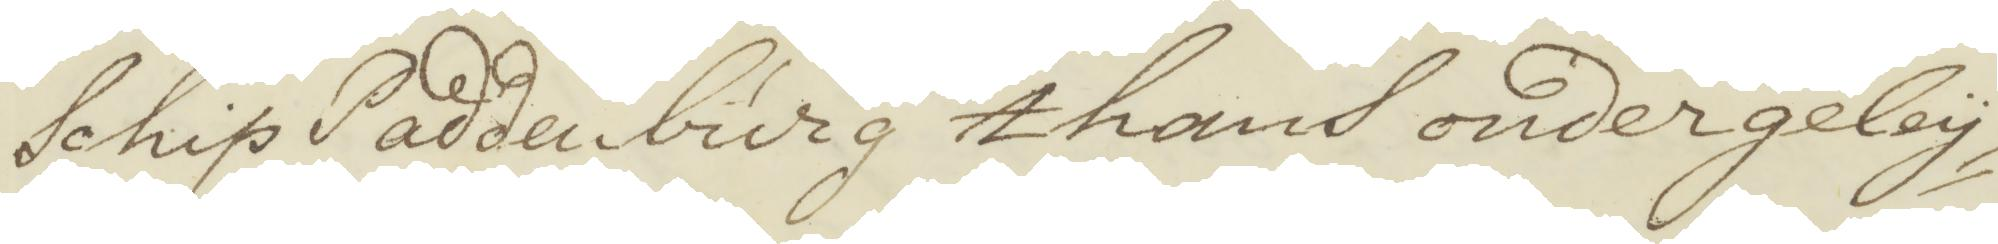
schip Paddenburg thans ondergeleij„
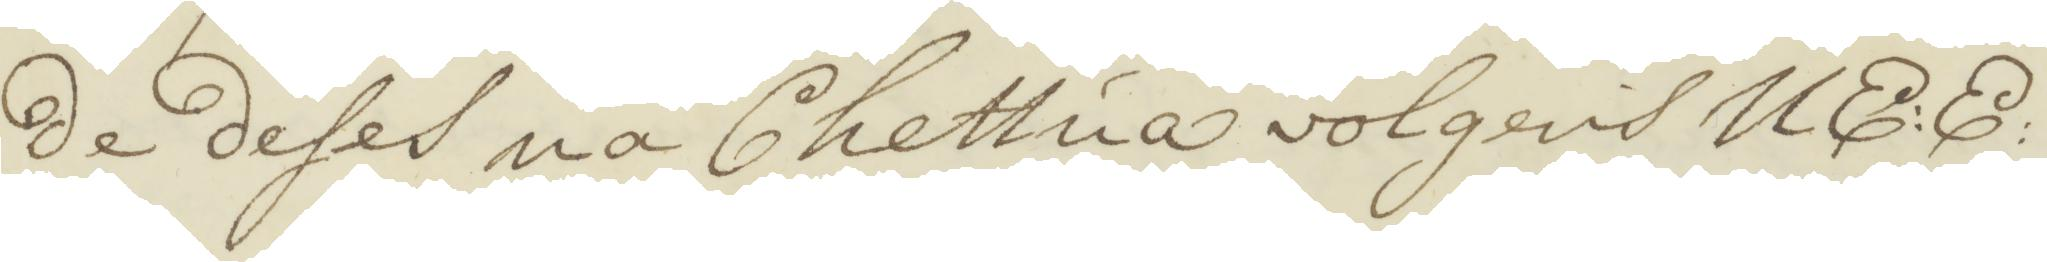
de deses na Chettua volgens UE: E:
